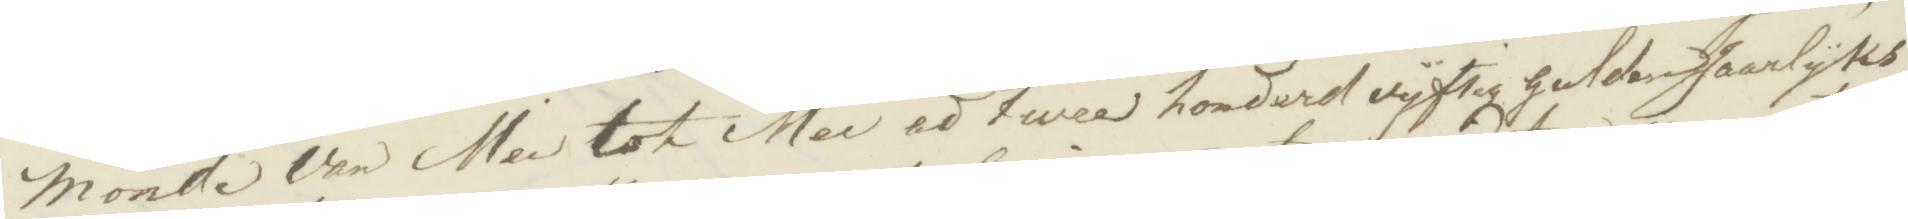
monde van Mei tot Mei ad twee honderd vijftig gulden Jaarlijks
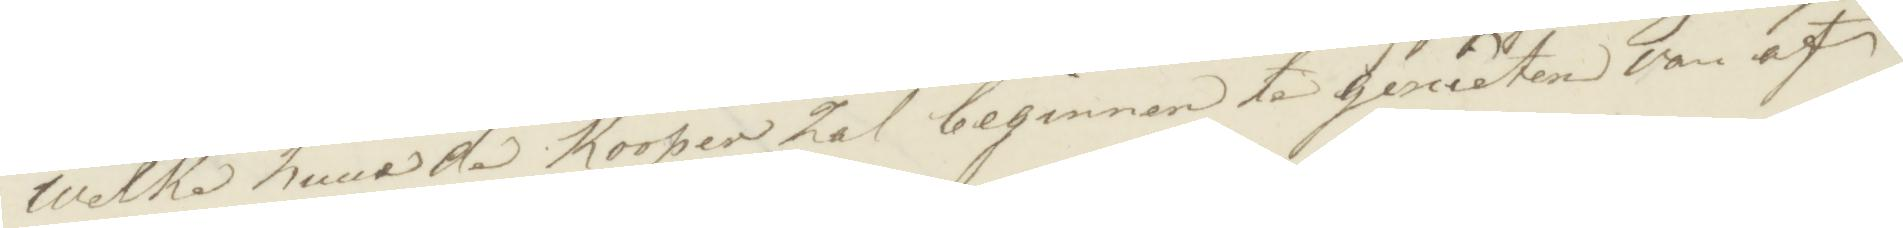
welke huur de Kooper zal beginnen te genieten van af
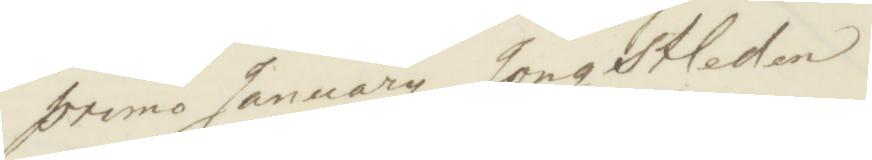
primo January Jongstleden.
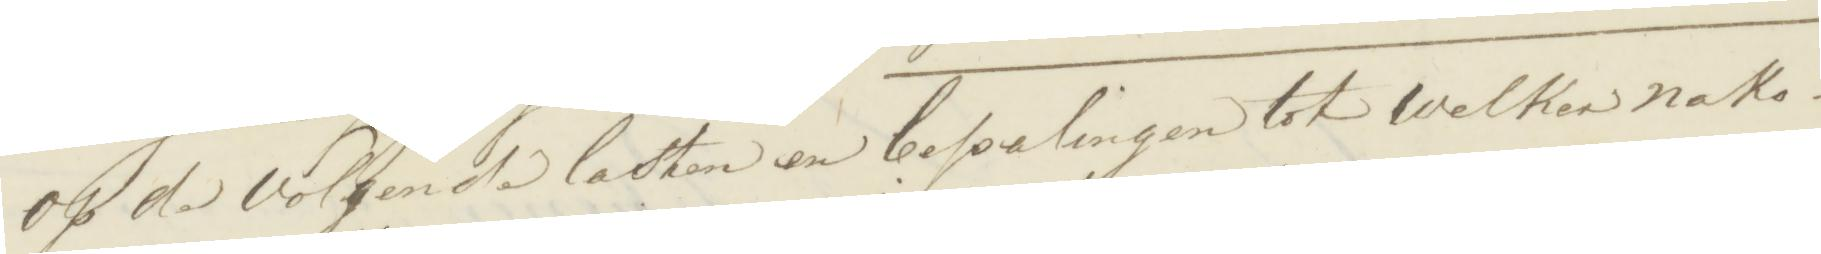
op de volgende lasten en bepalingen tot welken nako
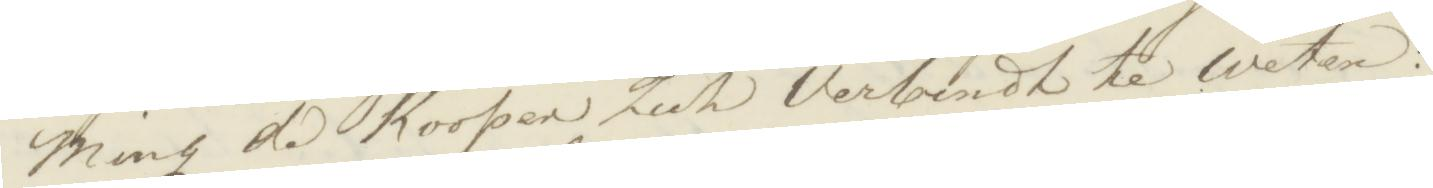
ming de Kooper zich verbindt te weten:
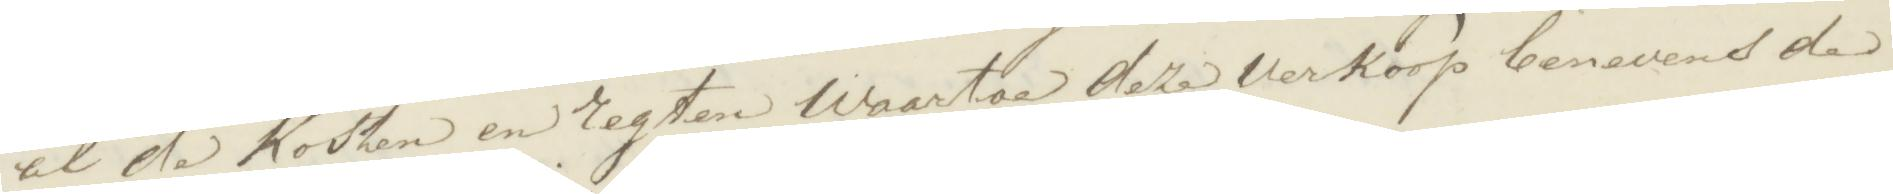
al de kosten en regten waartoe deze verkoop benevens de
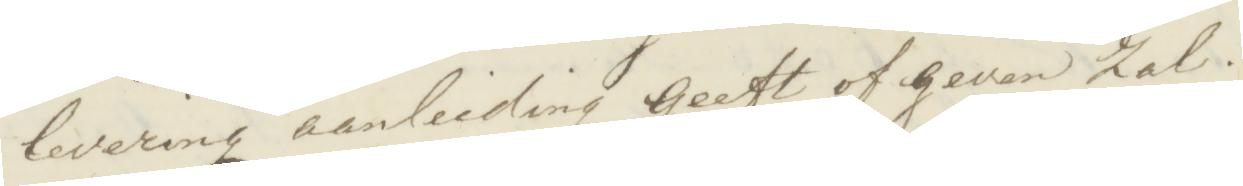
levering aanleiding geeft of geven zal.
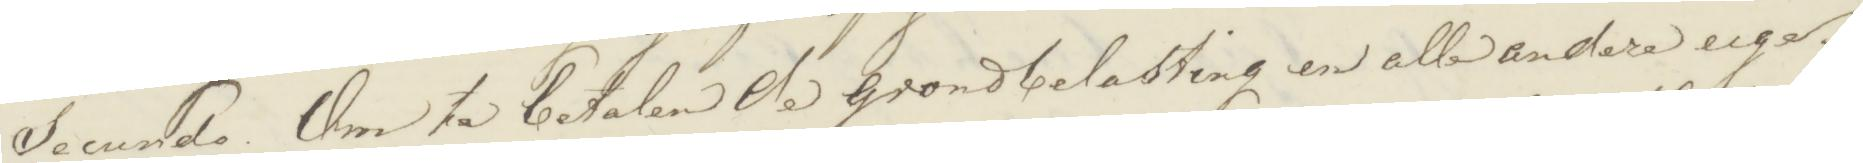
secundo Om te betalen de grondbelasting en alle andere eige
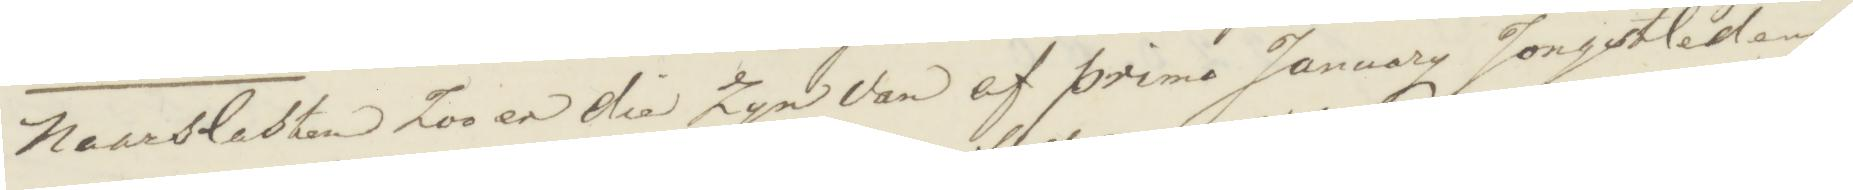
naarslasten zoo er die zyn van af primo January Jongstleden
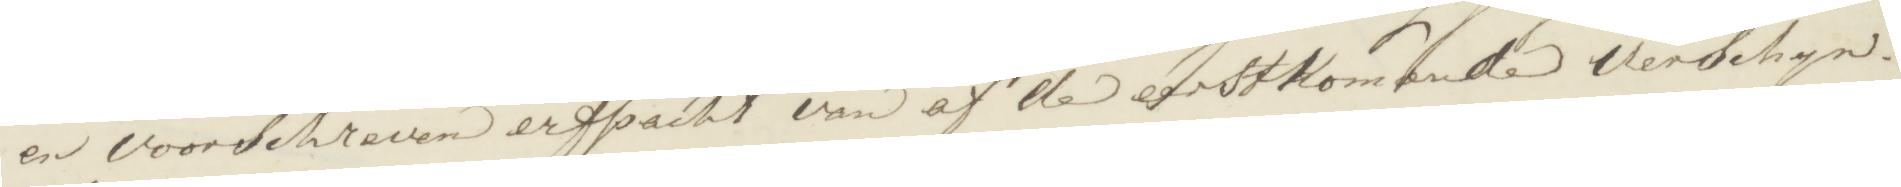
en voorschreven erfpacht van af de eerstkomende verschyn.
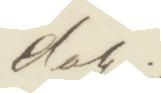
dag.
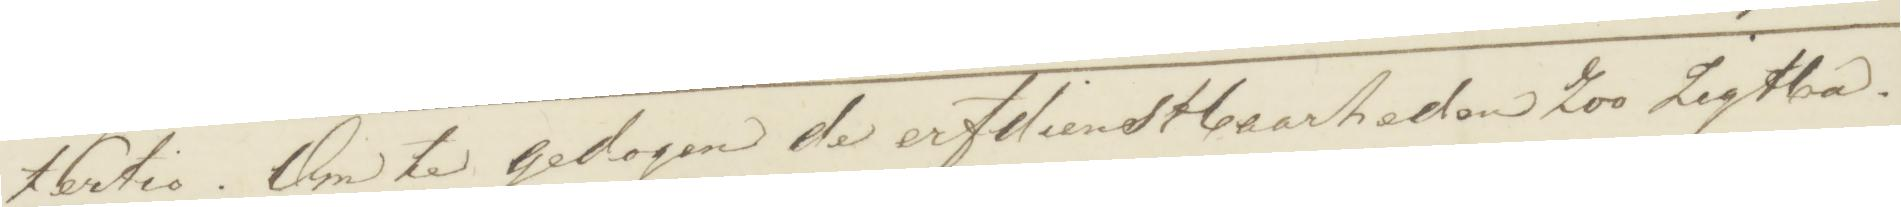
tertio. Om te gedogen de erfdienstbaar heden zoo zigtba-
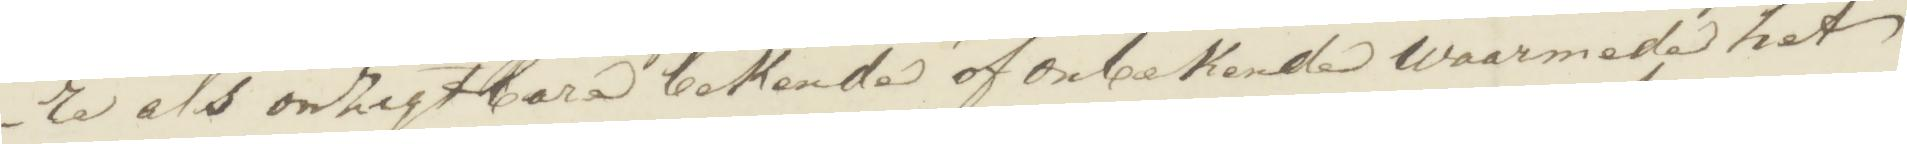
-re als onzigtbare bekende of onbekende waarmede het
